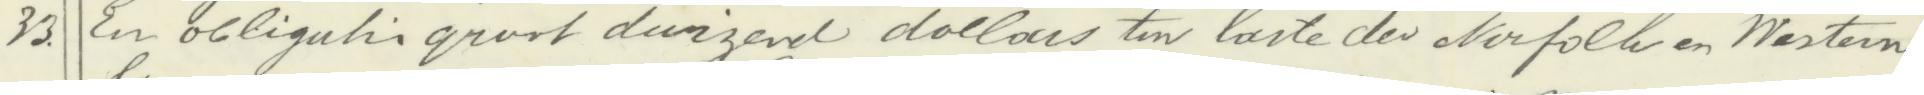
33. Een obligatie groot duizend dollars ten laste der Norfolk en Western
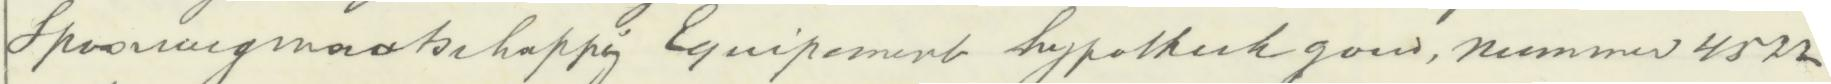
Spoorwegmaatschappij Equipment hypotheek goud, nummer 4522
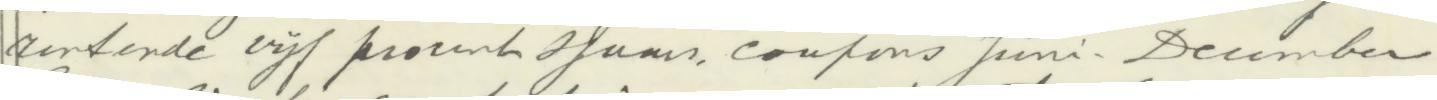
rentende vijf procent sjaars, coupons Juni - December
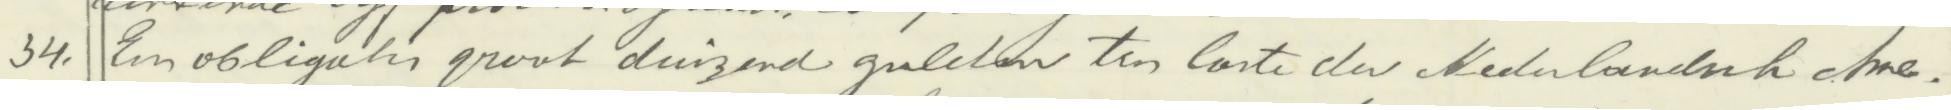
34. Een obligatie groot duizend gulden ten laste der Nederlandsch Ame
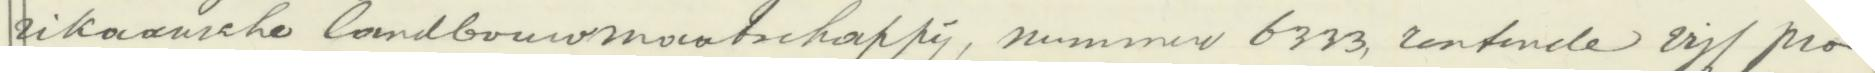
rikaansche landbouwmaatschappij, nummer 6333, rentende vijf pro-
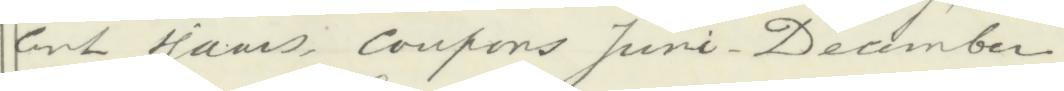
cent sjaars, coupons Juni - December
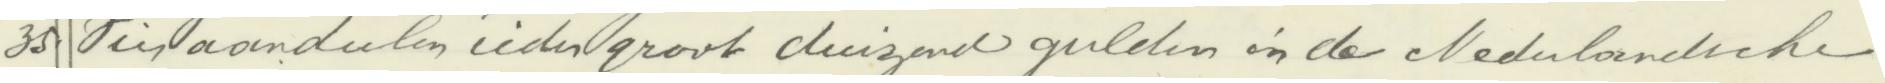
35. Vier aandeelen ieder groot duizend gulden in de Nederlandsche
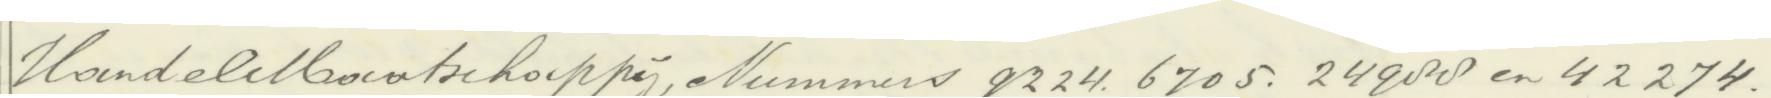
HandelMaatschappij, Nummers 9224. 6705. 24988 en 42274.
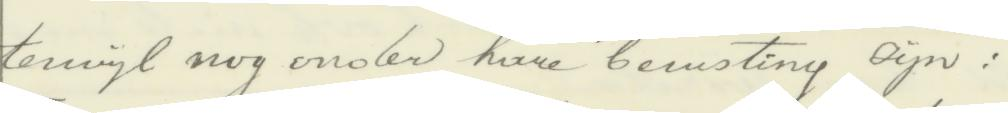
terwijl nog onder hare berusting zijn:
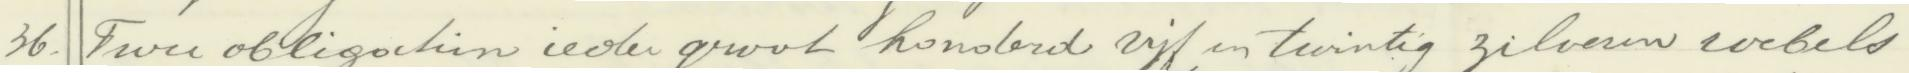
36. Twee obligatien ieder groot honderd vijf en twintig zilveren roebels
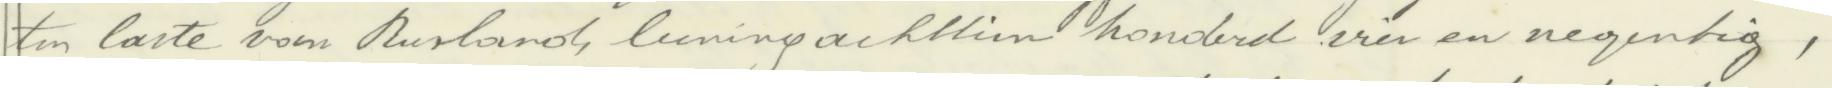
ten laste van Rusland leening achttien honderd vier en negentig,
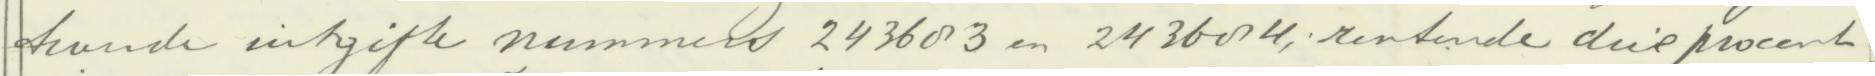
houde uitgifte nummers 243683 en 243684, rentende drie procent
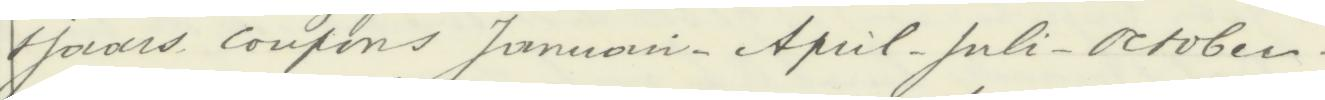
sjaars coupons Januari- April - Juli - October
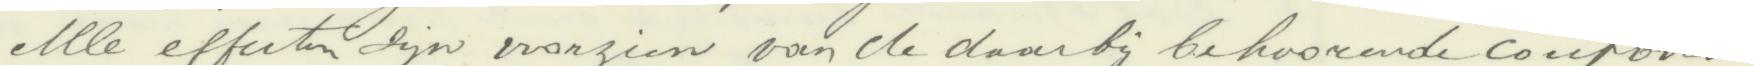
Alle effecten zijn voorzien van de daarbij behoorende coupons
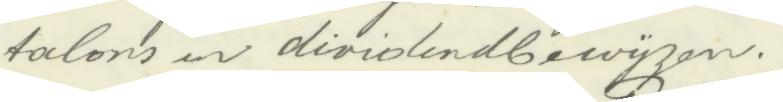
talons en dividendbewijzen.
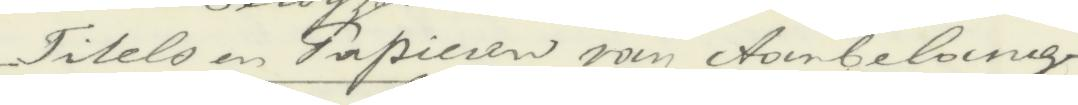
Titels en Papieren van Aanbelang
